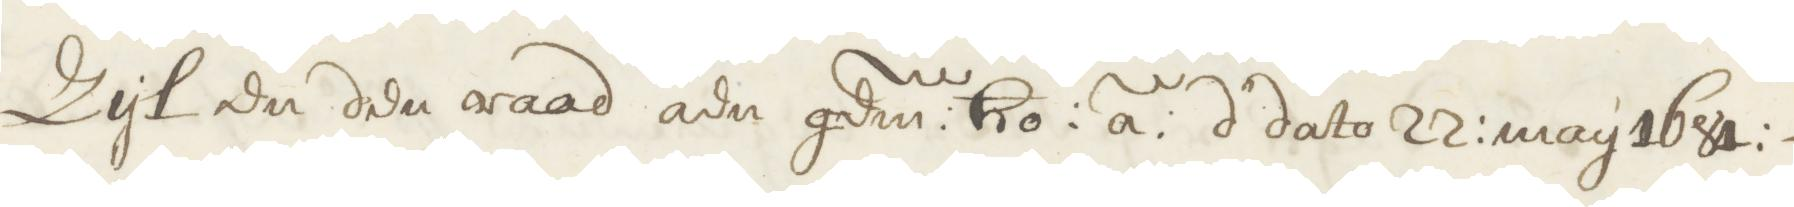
zijl en den raad aen gem:n ho: a:' d’ dato 22:' maij 1684:
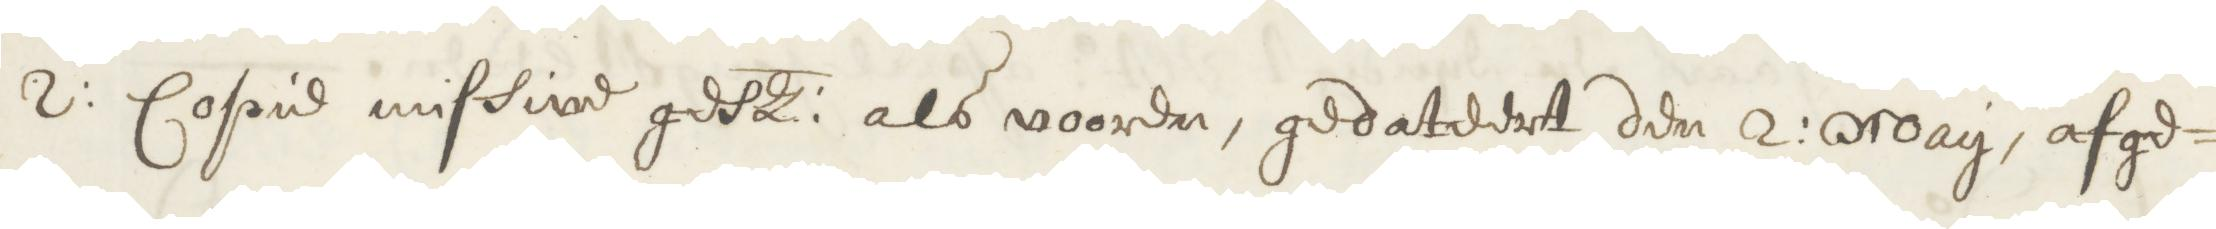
2: Copie missive gesz: als vooren, gedateert den 2: Maij, afge=
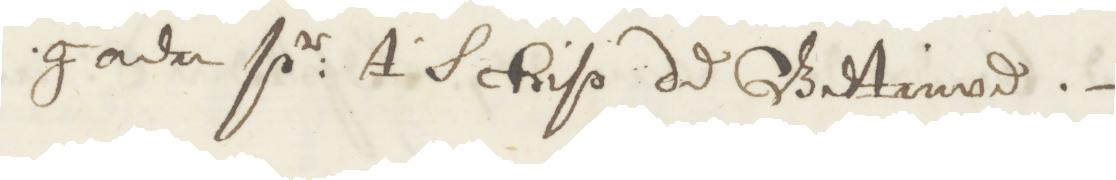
gaen p:r t' schip de Betuwe.—
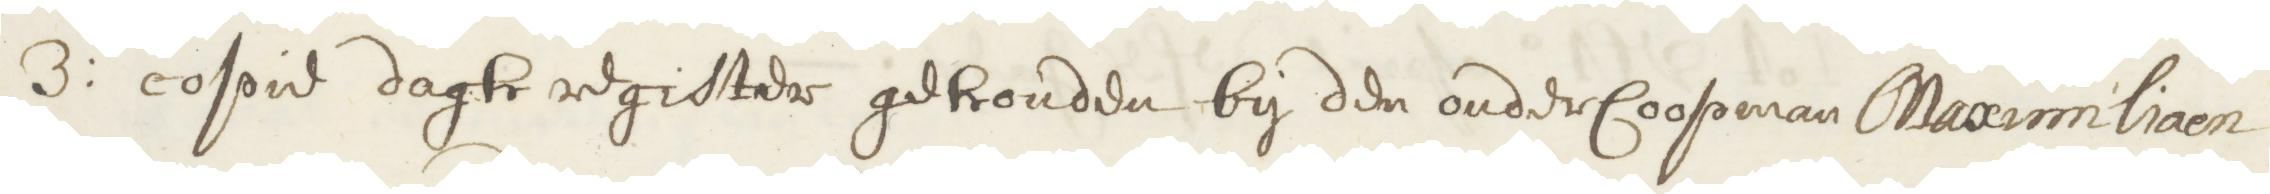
3: copie dagh register gehouden bij den onder Coopman Maximiliaen
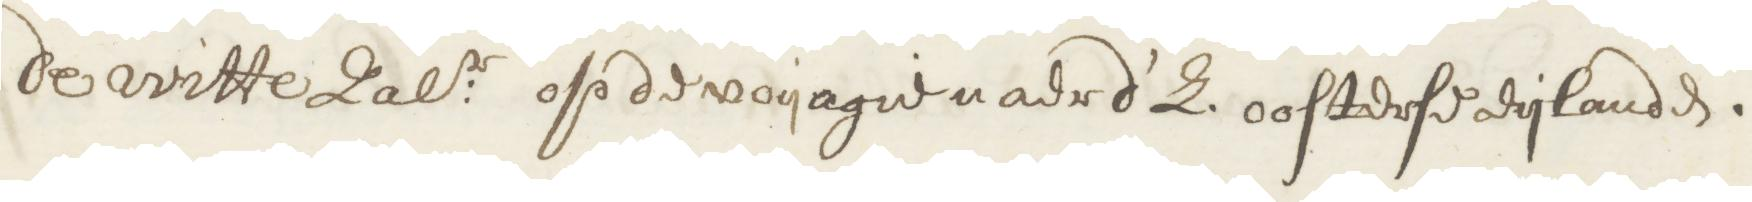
de witte zal:r op de voijagie naer d’ z. oosterse eijlanden.
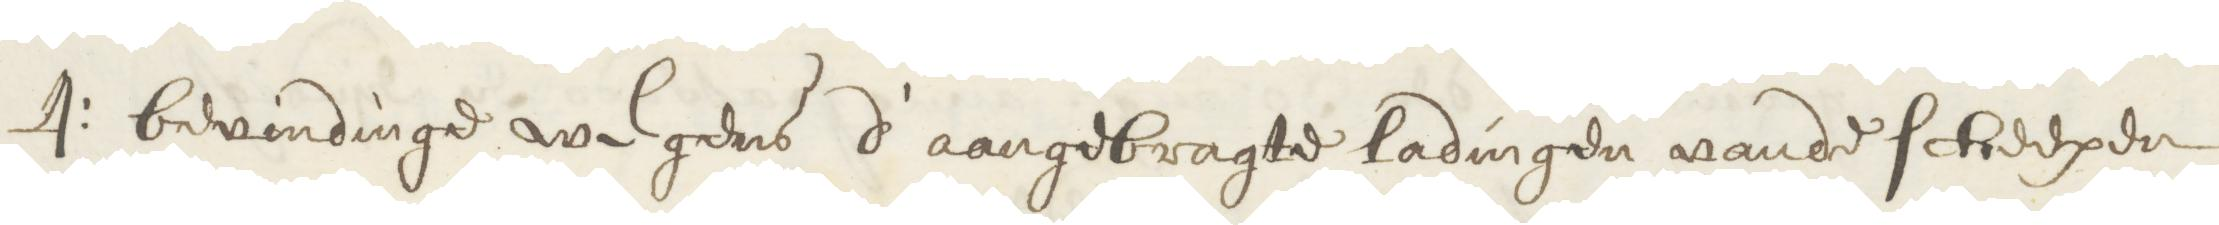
4: bevindinge wegens d’ aangebragte ladingen van de scheepen
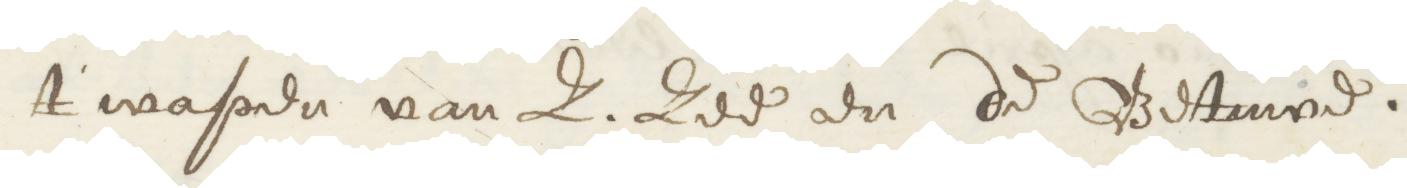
t' wapen van Z. zee en de Betuwe.
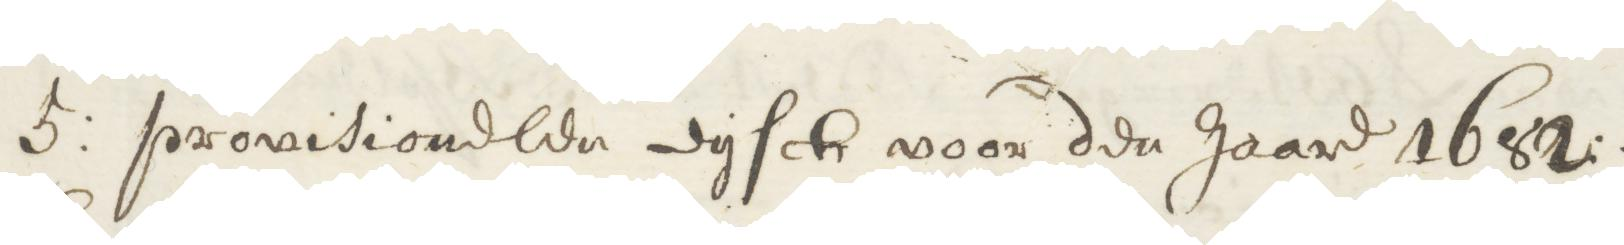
5: provisionelen eijsch voor den Jaare 1682:
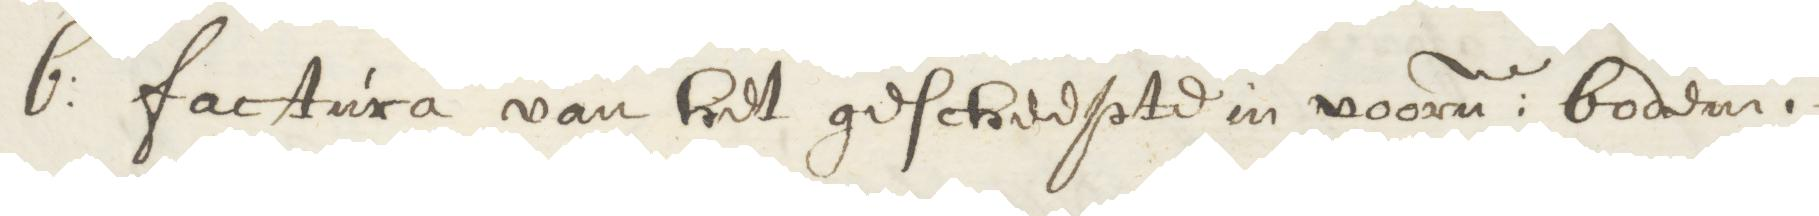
6: factura van het gescheepte in voorn:' bodem.
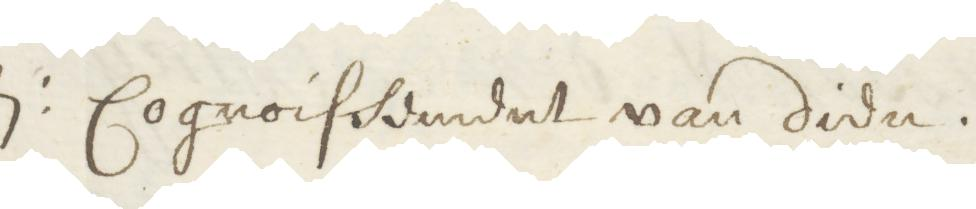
7: Cognoissement van dien.
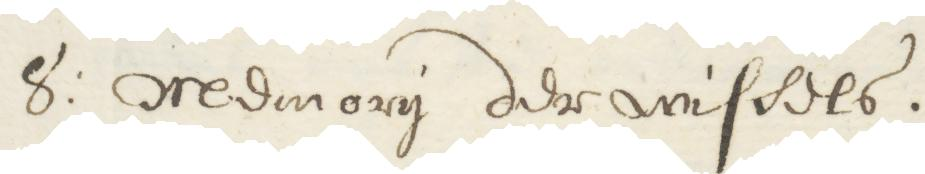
8: Memorij der wissels
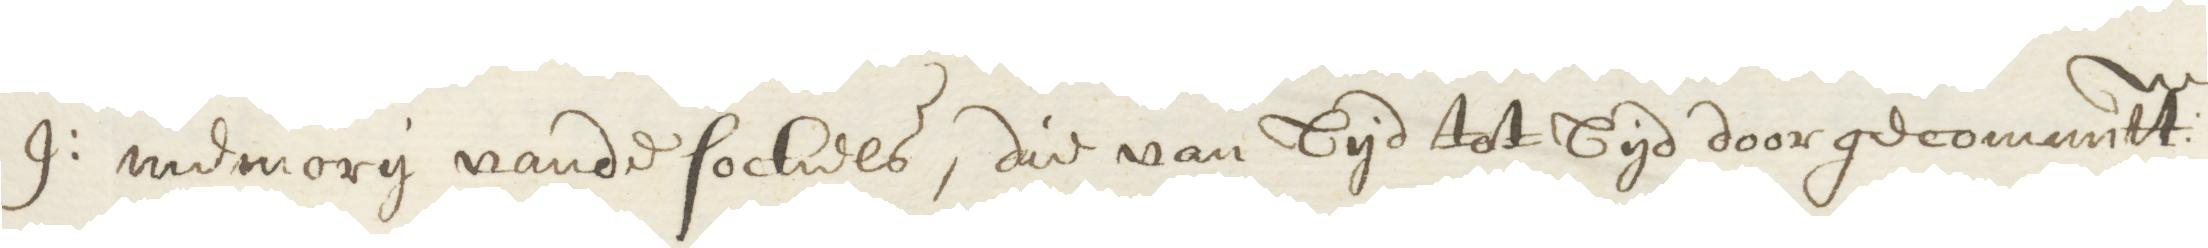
9: memorij vande sockels, die van Tijd tot Tijd door gecommitt:
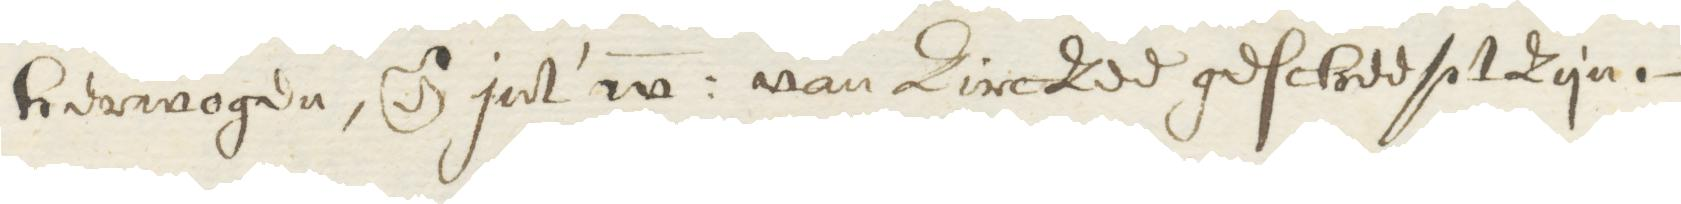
herwogen, ende jnt' w: van Zirczee gescheept zijn.
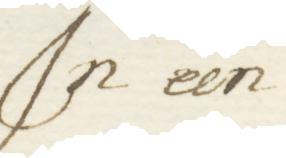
Jn een
